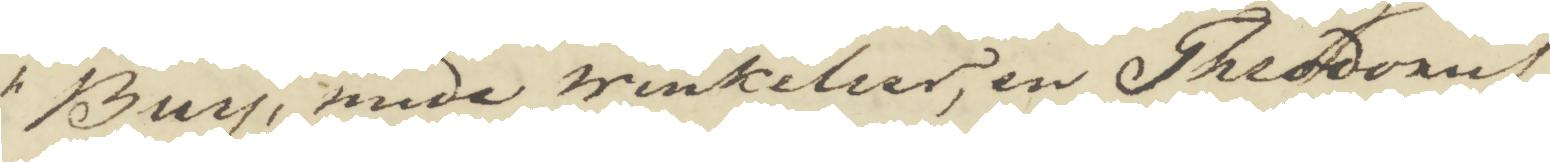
Buy, mede winkelier, en Theodorus
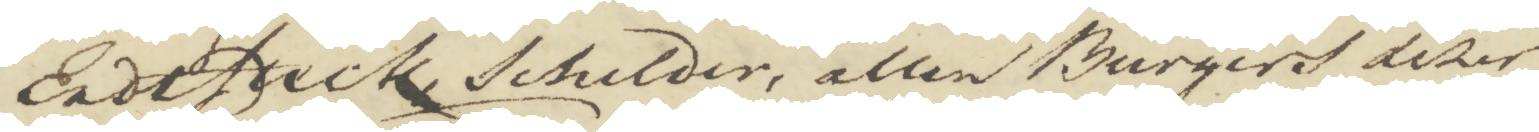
Erdtsieck, Schilder, allen Burgers dezer
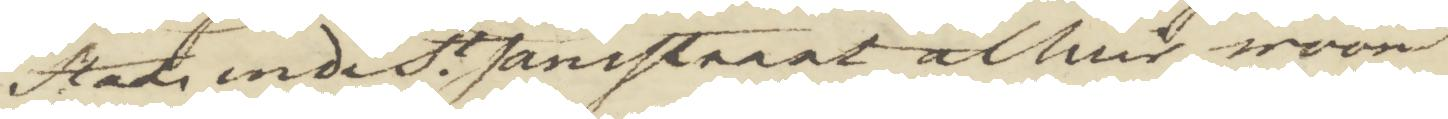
Stad, in de S.t Janstraat alhier woon=
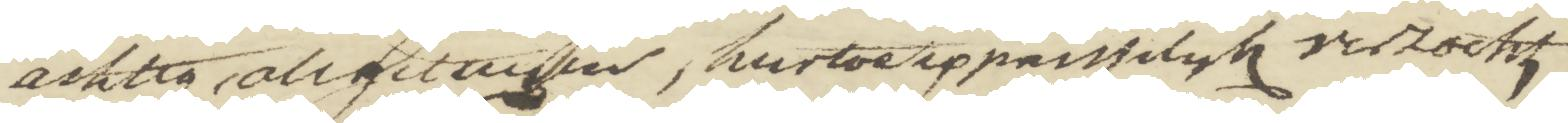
achtig, als getuigen, hiertoe expresselyk verzocht
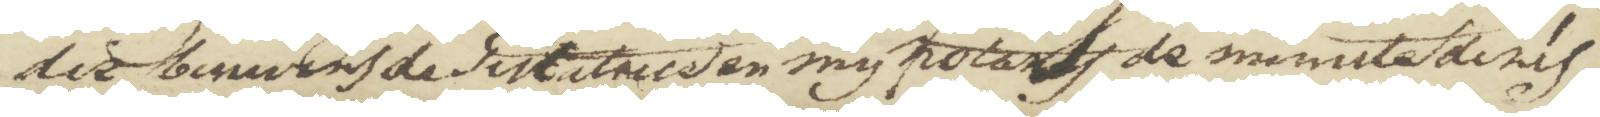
dit benevens de Testatrice en my notaris de minute dezes,
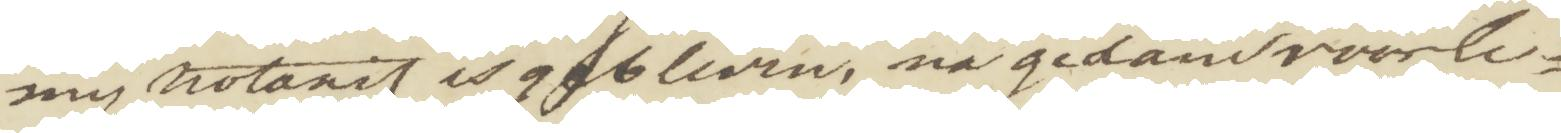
my notaris is gebleven, na gedane voorle=
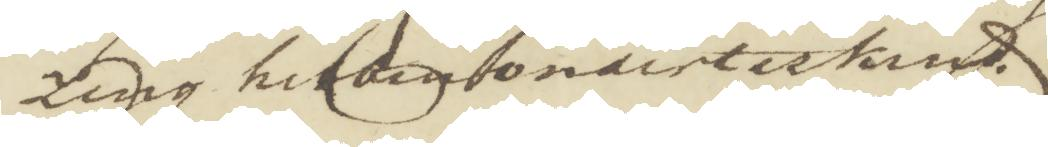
zing hebben onderteekend.
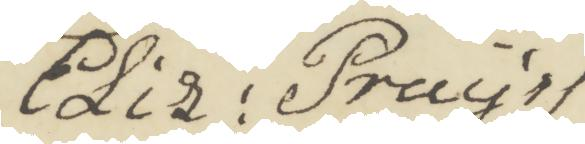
Eliz. Pruijss
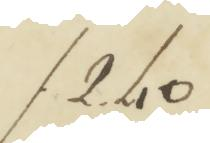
ƒ2,40
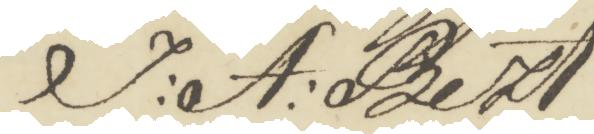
J:A: Best
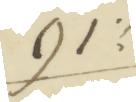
91:
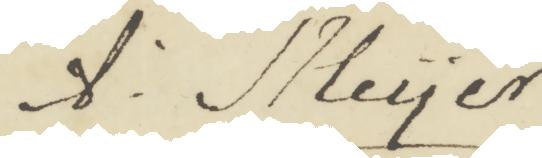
A: Meijer
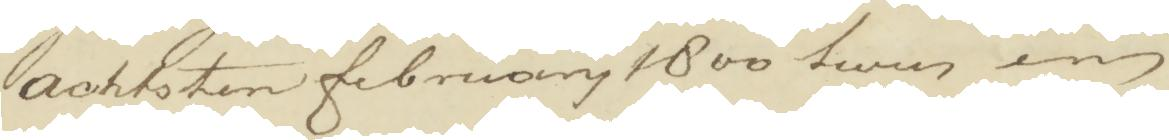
achtsten february 1800 twee en
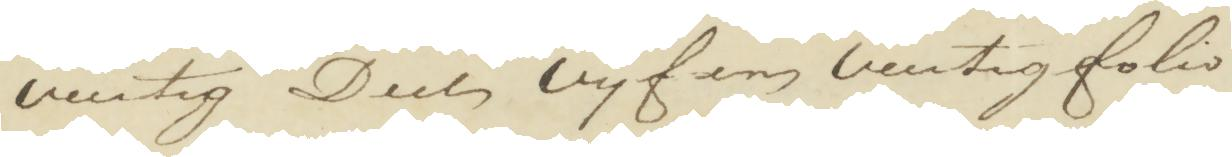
veertig Deel vyf en veertig folio
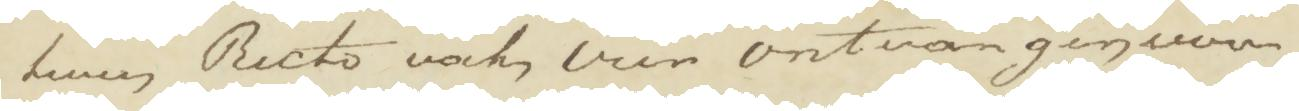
twee Recto vak vier ontvangen voor
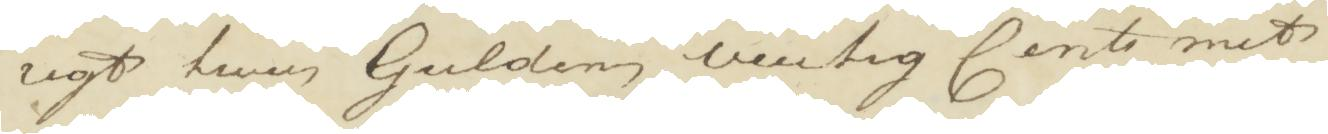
regt twee Guldens veertig Cents met
